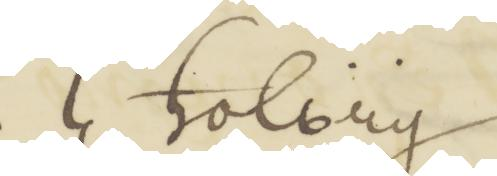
tolvrij
